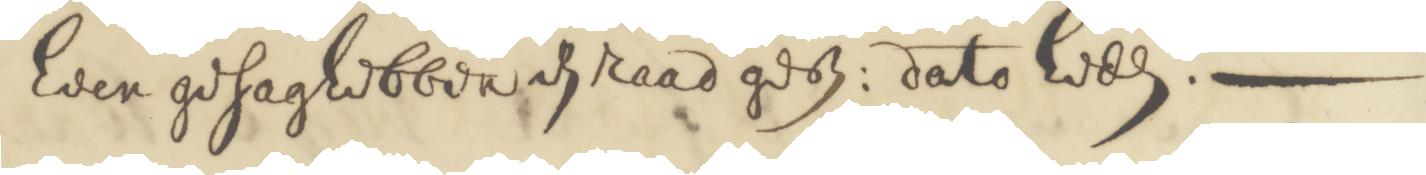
heer gesaghebber en raad gesz: dato heden. —
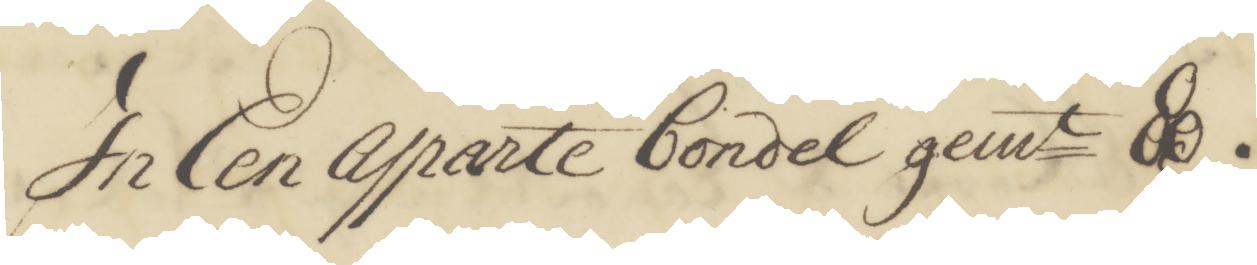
Jn Een apparte bondel gem=t.
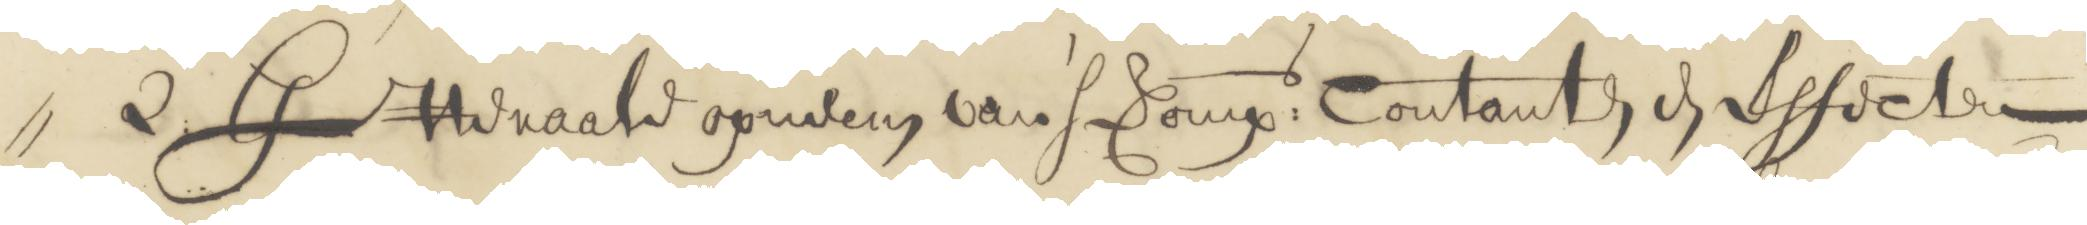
„ 2: Generaale opneem van ’s EComp:s contanten en Effecten
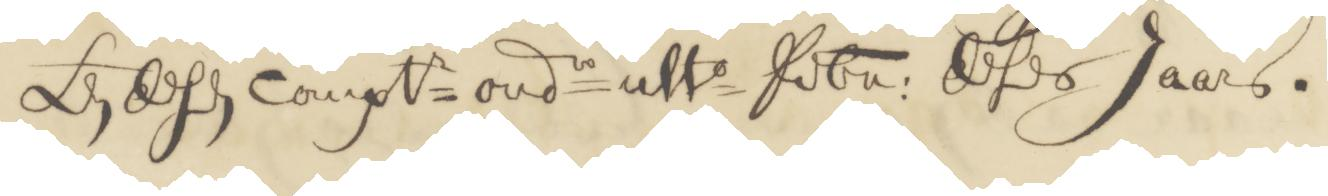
ten desen compt=r ond=r ult=o febr: deses Jaars.
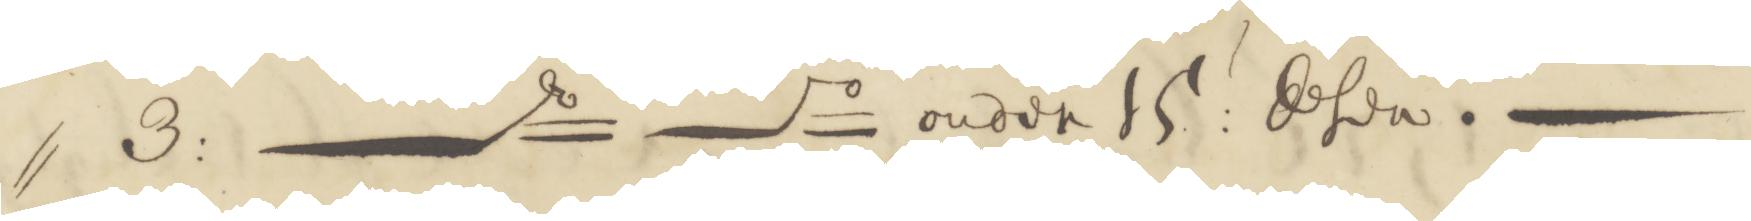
„ 3: _=o _=o onder 15:' desen. —
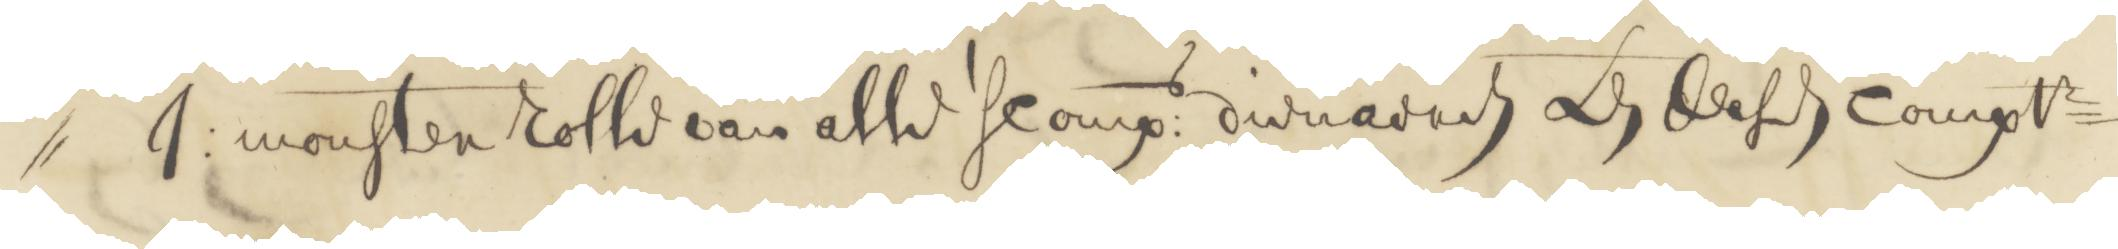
„ 4: monster rolle van alle ’scomp:s dienaeren ten deesen compt=r
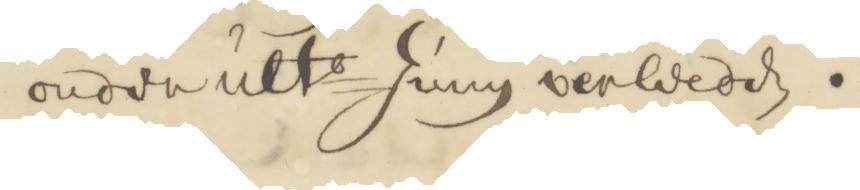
onder ult=o Junij verleeden.
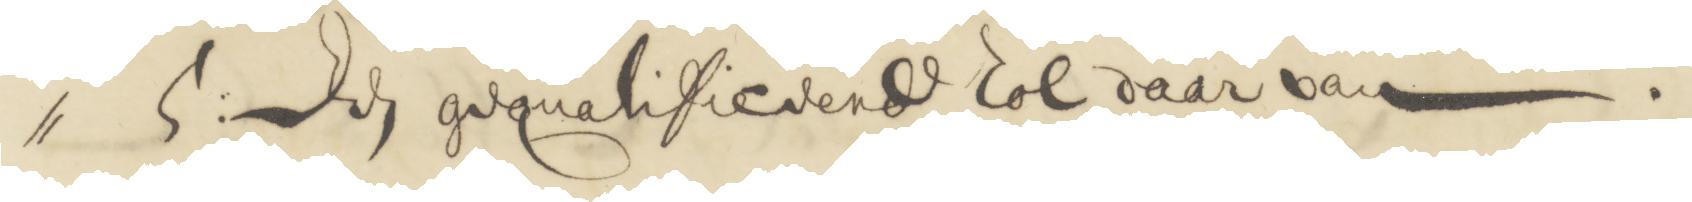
„ 5: Een gequalificeerde rol daar van.
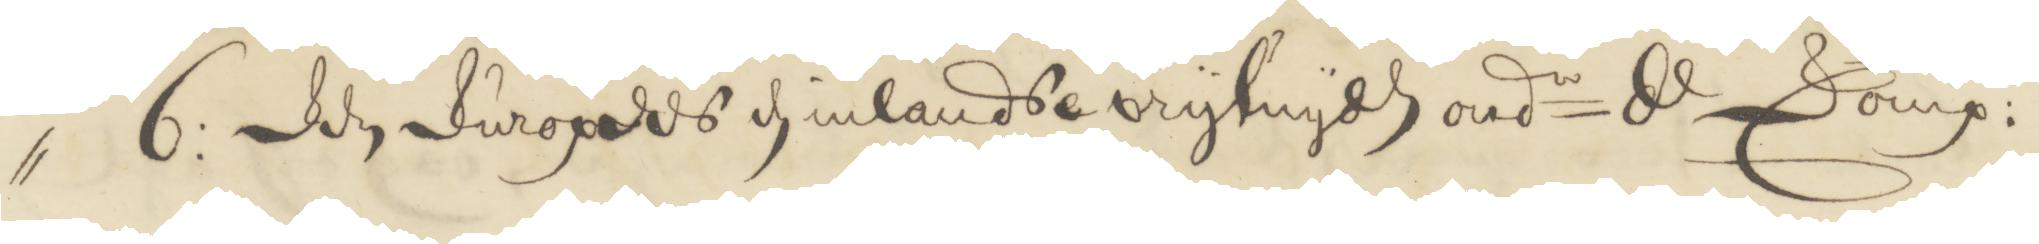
„ 6: Een Europees en inlandse vrijluijden ond=r de EComp:
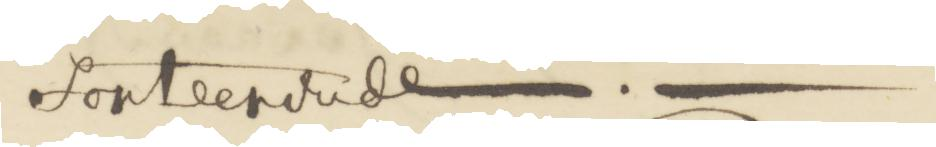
sorteerende. —
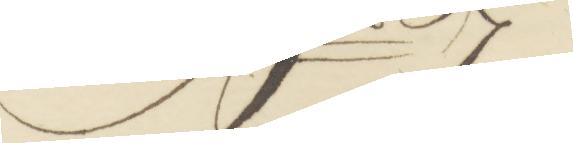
N=o 7
